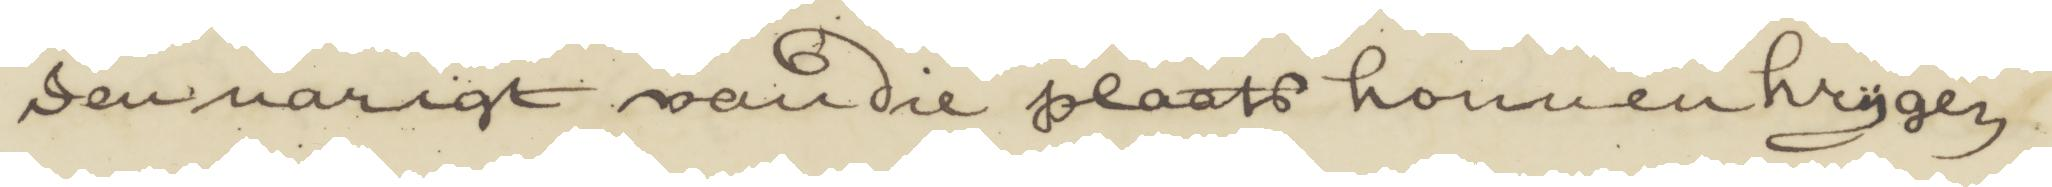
een narigt van die plaats konnen krijgen
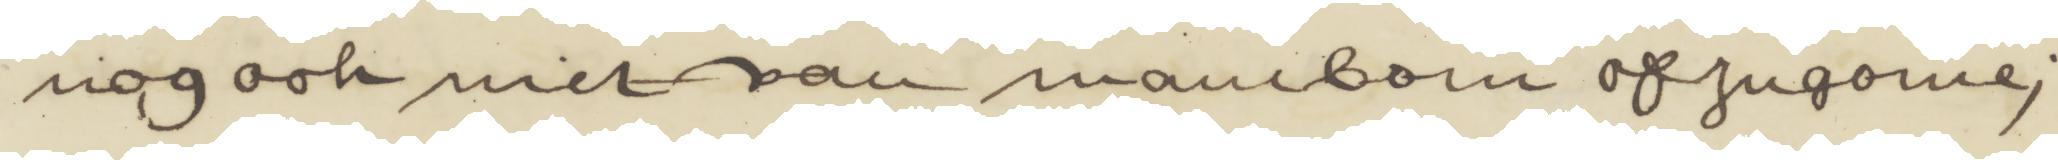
nog ook niet van maniboni of jngome;
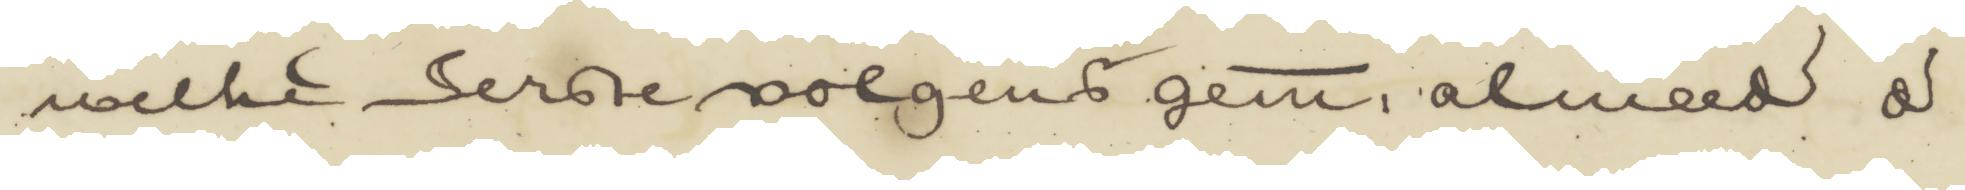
welke Eerste volgens gem: almeede de
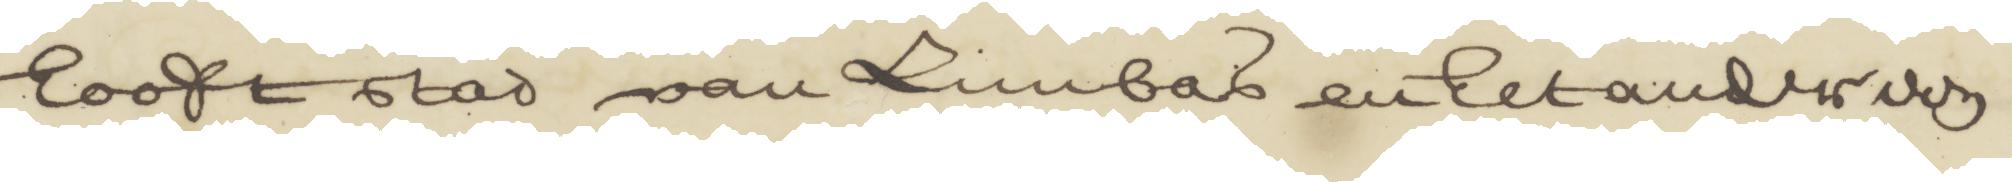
hooft stad van zimbas en het ander een
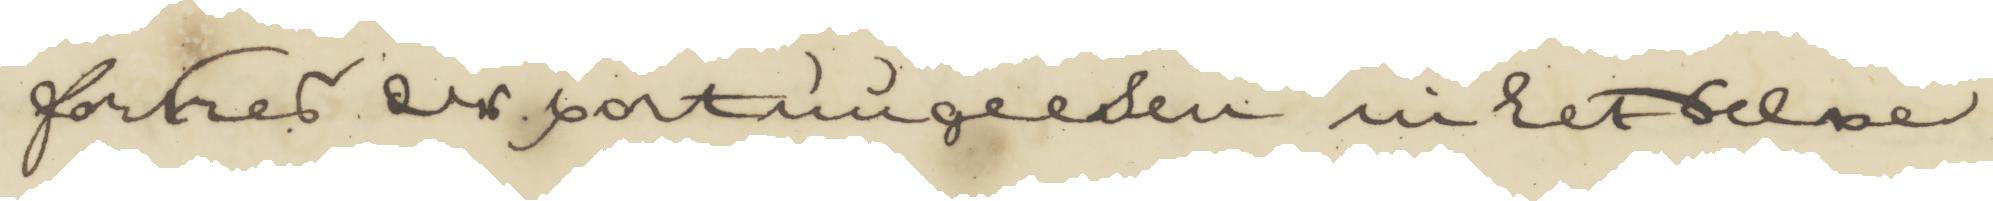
fortres der portuugeesen in het selve
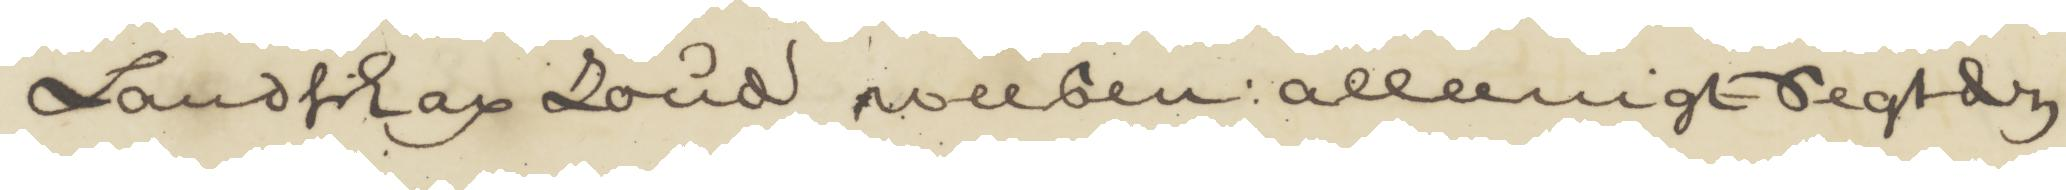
Landschap zoude weesen: alleenigt segt den
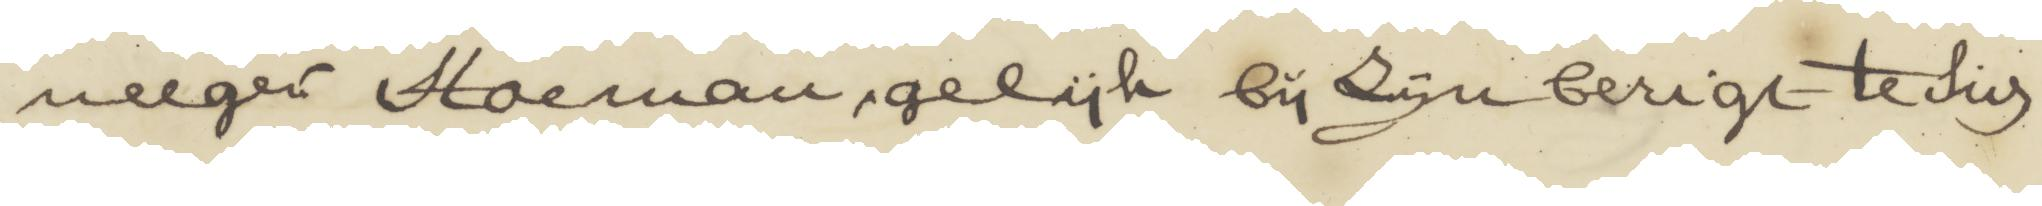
neeger Hoeman, gelijk bij zijn berigt te sien
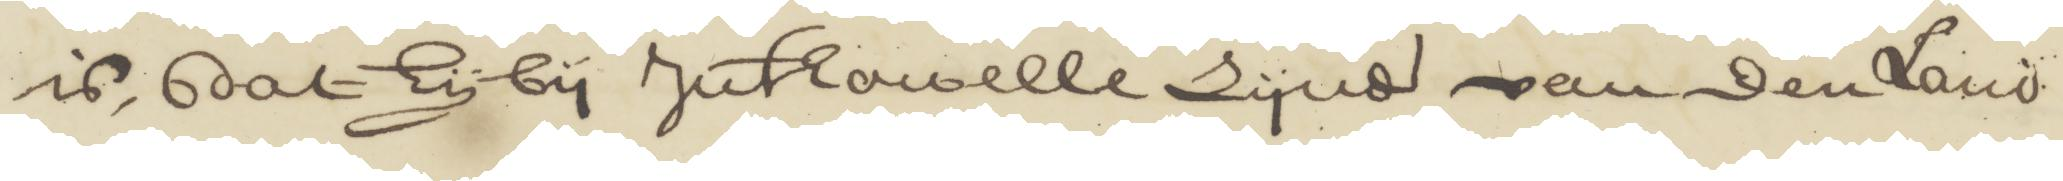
is, dat hij bij Jnthowelle zijnde van een Land
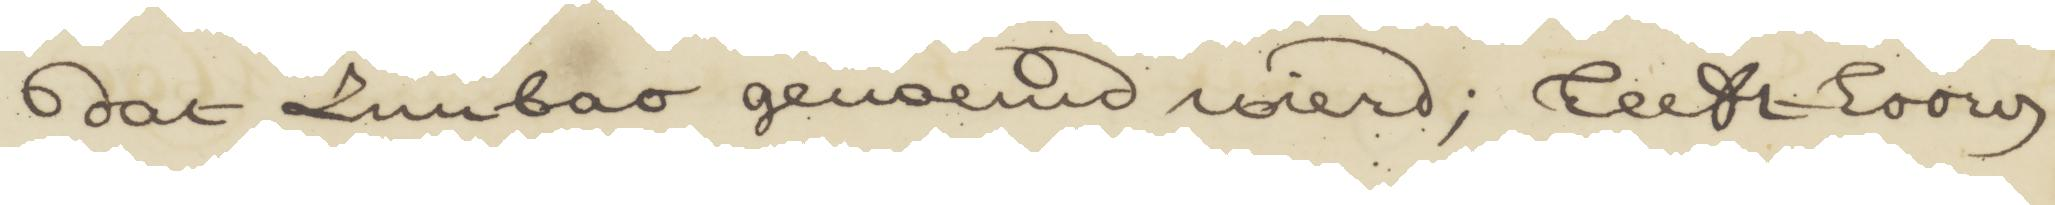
dat zimbas genoemd wierd; heeft hooren
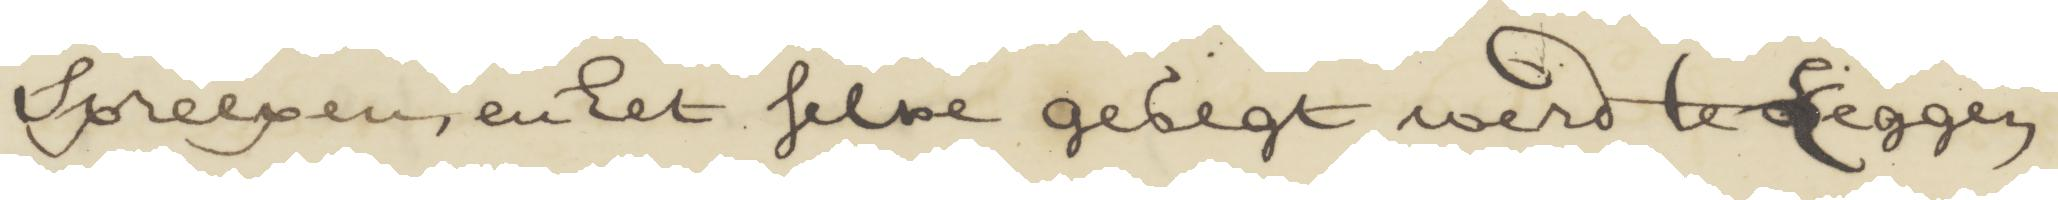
spreepen, en het selve gesegt werd te Leggen
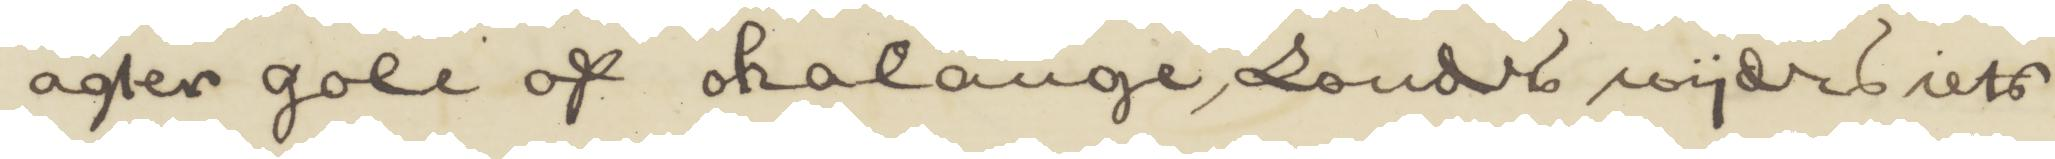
agter gole of okalange, zonder wijders iets
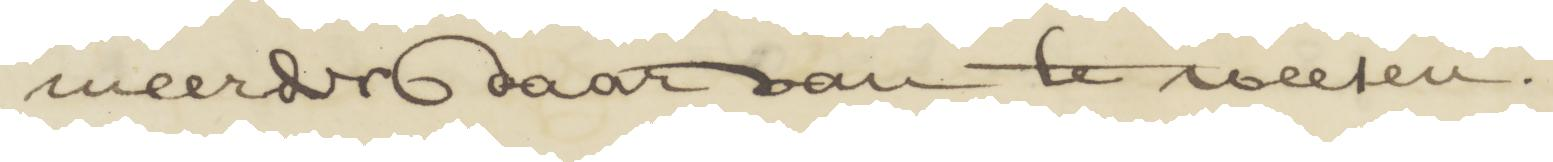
meerder daar van te weeten.
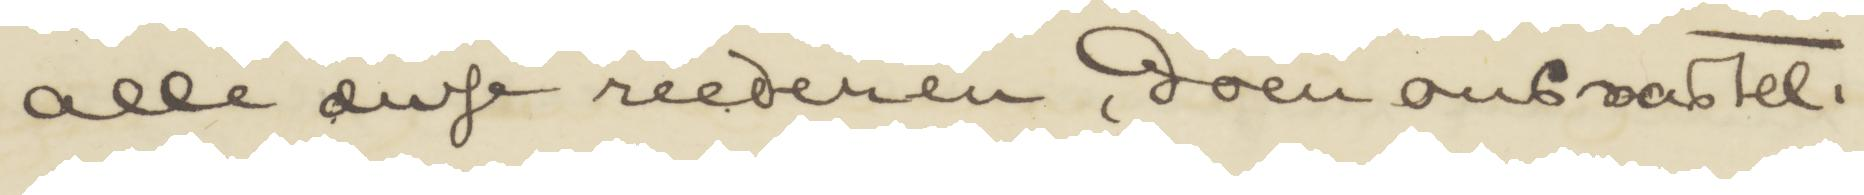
alle dese reederen, doen ons vastelijk
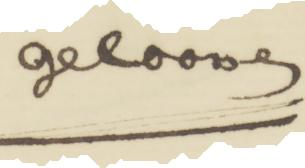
gelooven
